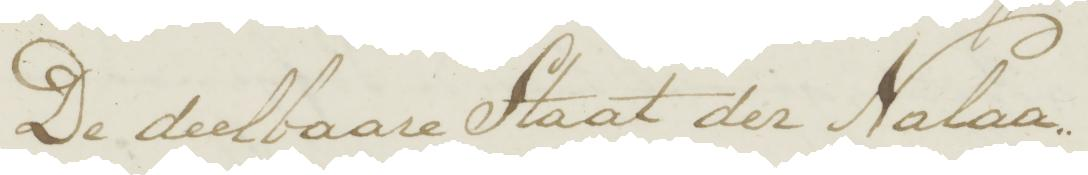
De deelbaare Staat der Nalaa„
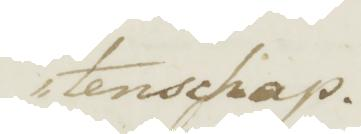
„tenschap.
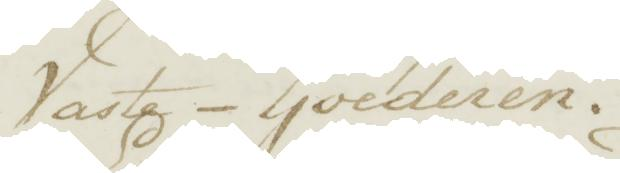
Vaste - Goederen.
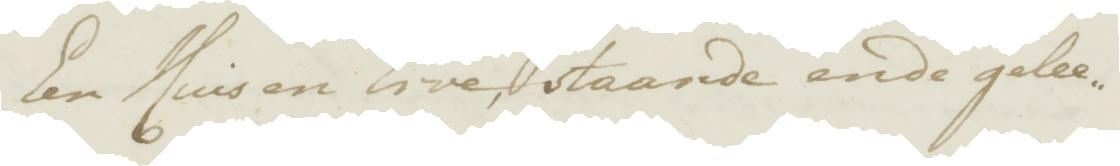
Een Huis en Erve, staande ende gelee„
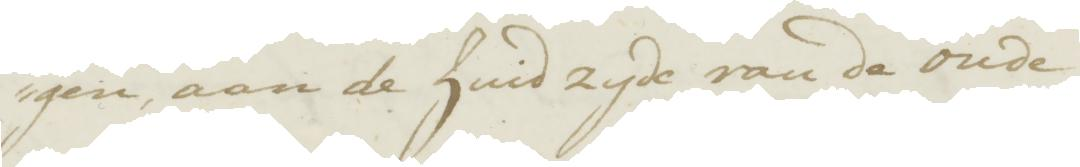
„gen, aan de Zuid zyde van de oude
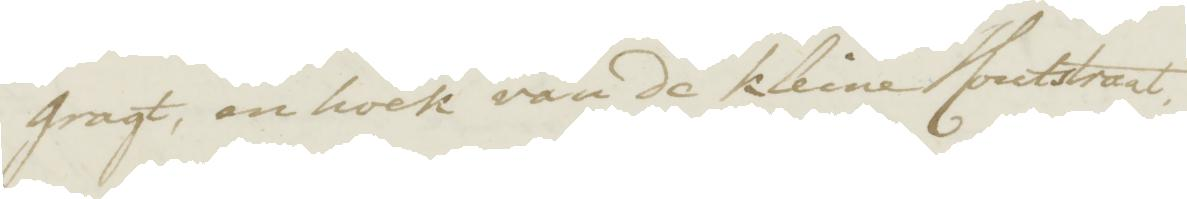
gragt, en hoek van de kleine Houtstraat,
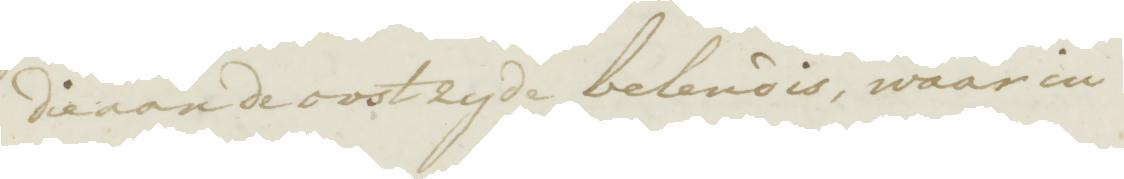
die aan de oostzyde belend is, waar in
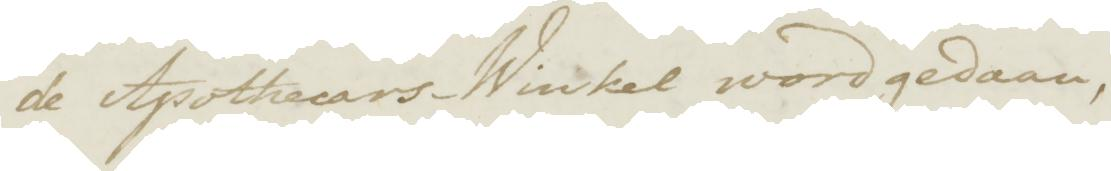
de Apothecars-Winkel word gedaan,
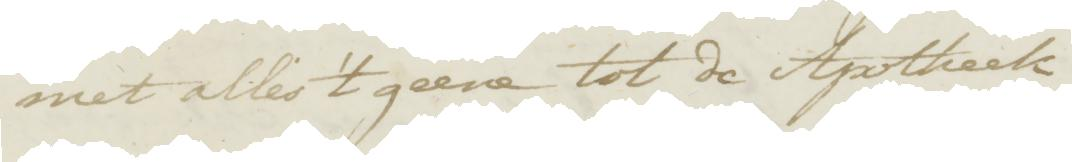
met alles ’t geene tot de Apotheek
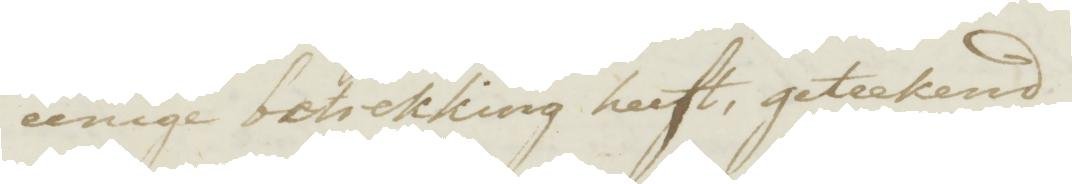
eenige betrekking heeft, geteekend
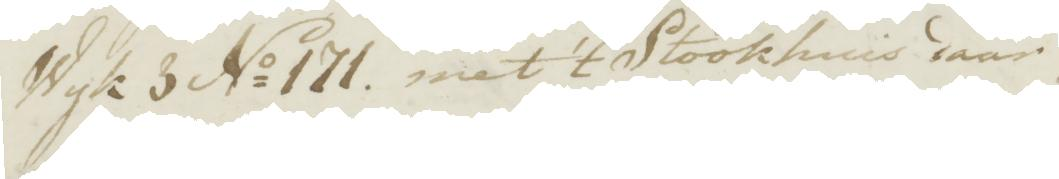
Wyk 3 N=o 171. met ’t Stookhuis daar„
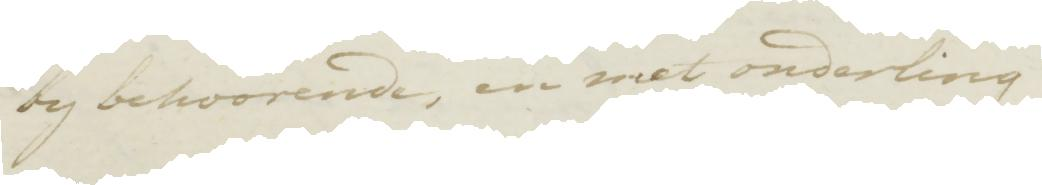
by behoorende, en met onderling
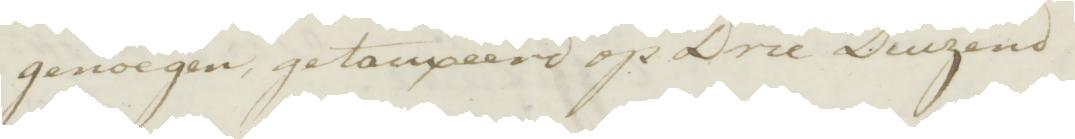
genoegen, getauxeerd op Drie Duizend
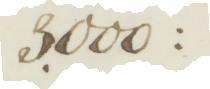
3.000:
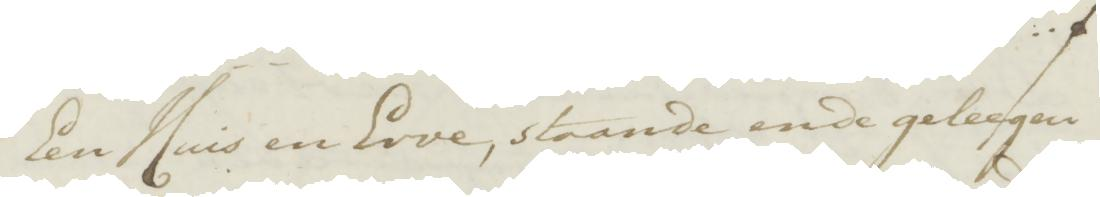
Een Huis, en Erve, staande ende geleegen
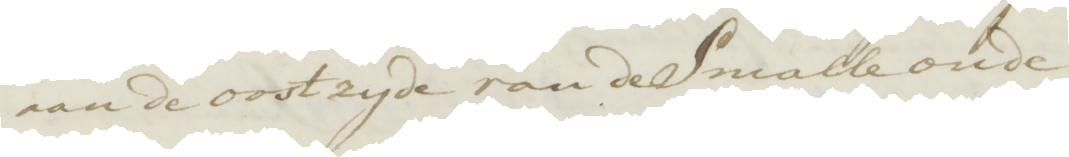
aan de oostzyde van de Smalle oude
